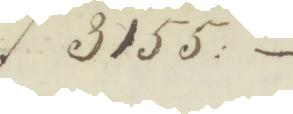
ƒ 3155: —
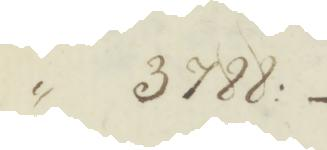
„ 3788: -
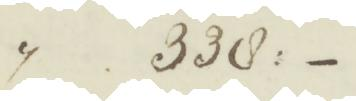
„ 338: —
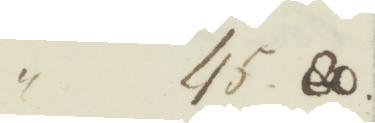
„ 45. 80
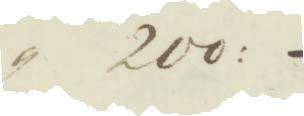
„ 200: -
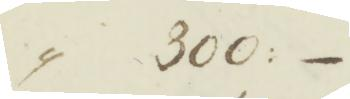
„ 300: —
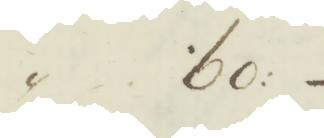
„ 60: -
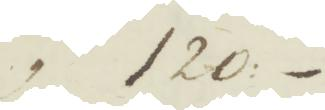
„ 120: —
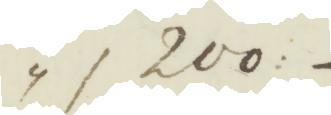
„ 200: —
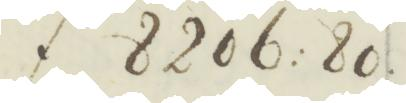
ƒ 8206: 80.
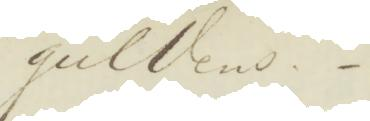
guldens. -
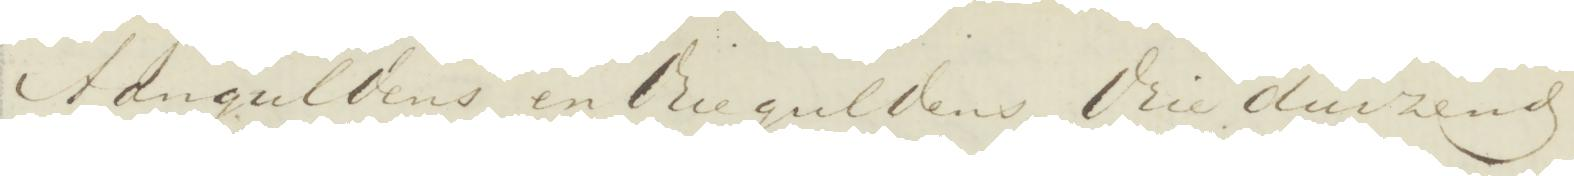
Aanguldens en Drie guldens Drie duizend
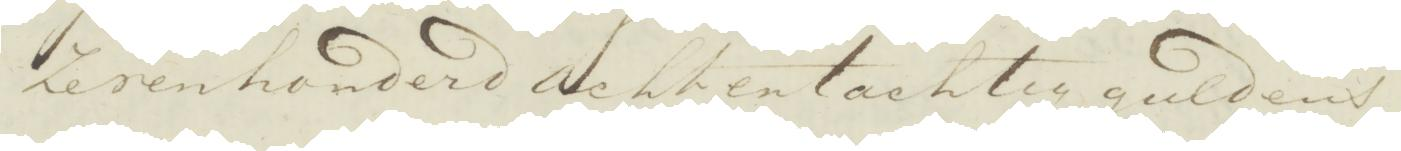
zevenhonderd acht entachtig guldens
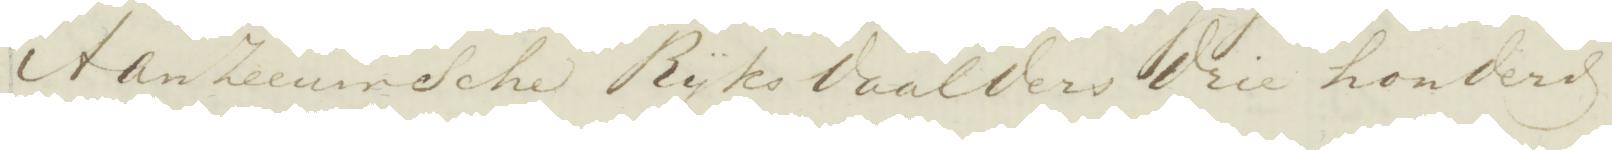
Aan Zeeuwsche Rijks daalders drie honderd
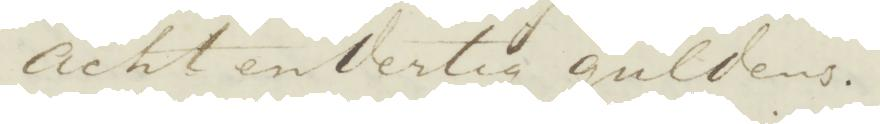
acht endertig guldens.
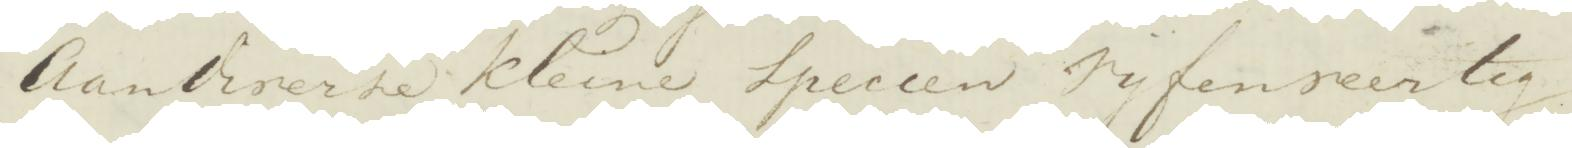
Aan diverse kleine specien Vijfenveertig
